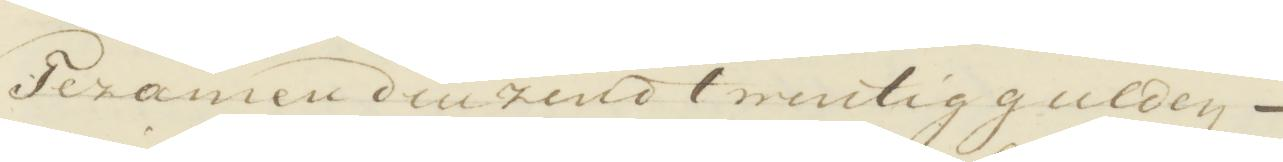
Tezamen duizend twintig gulden —
